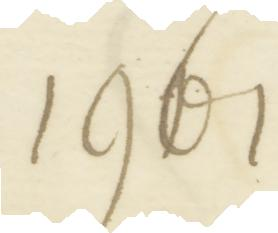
1961
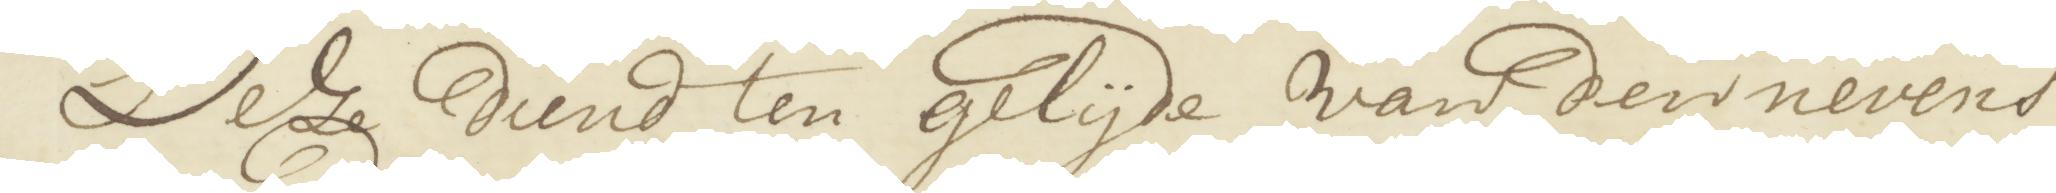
Deze diend ten gelijde van den nevens
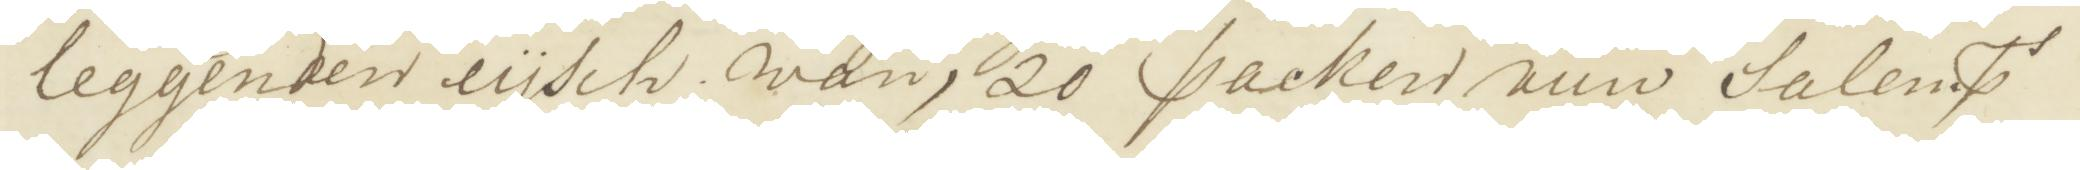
leggenden eijsch van, 20 packen ruw salemps
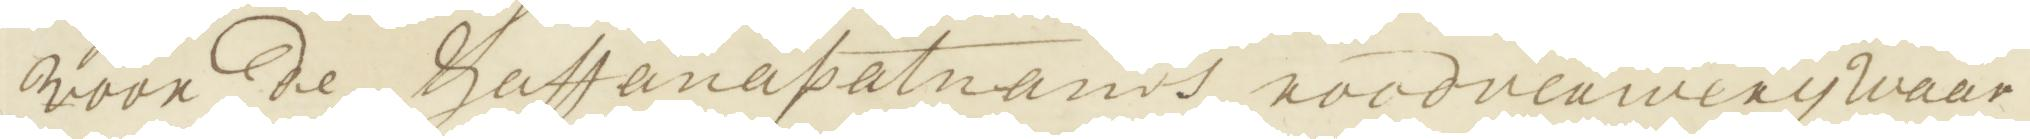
voor de Jaffanapatnams roodverwerywaar
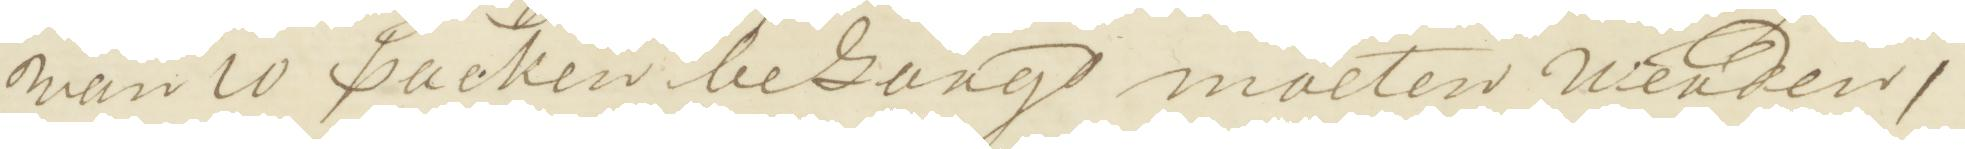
van 10 packen bezorgd moeten werden,
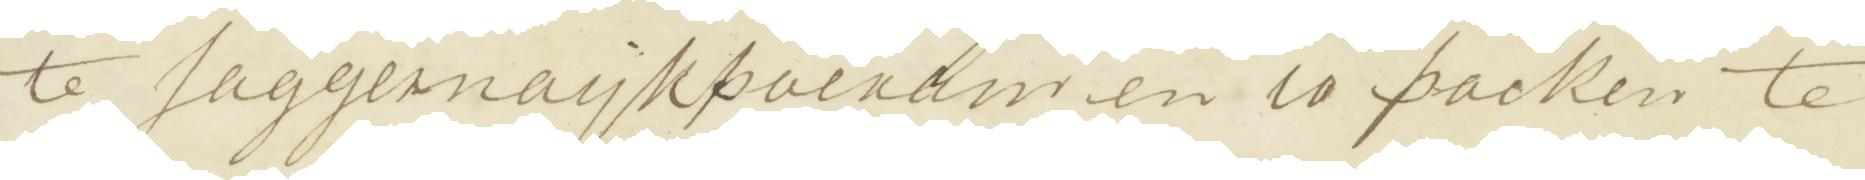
te saggernaijkpoeram en 10 packen te
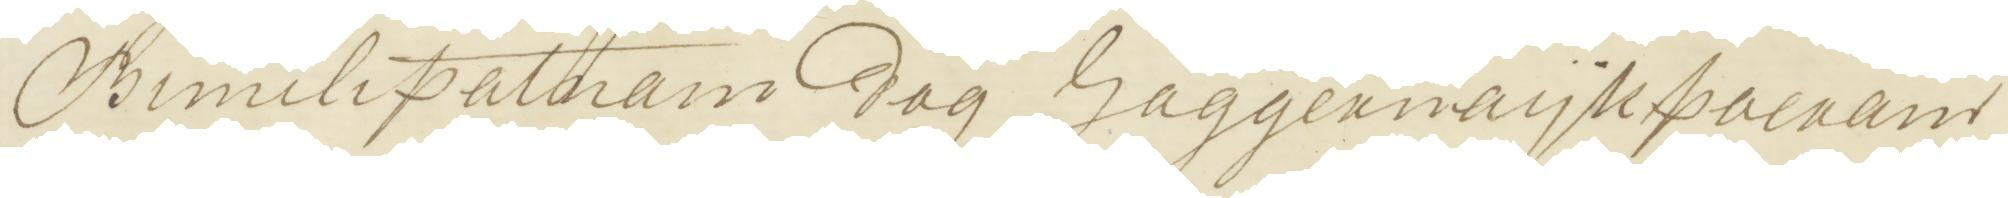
Bimilipatnam dog Jaggerwaijkpoeram
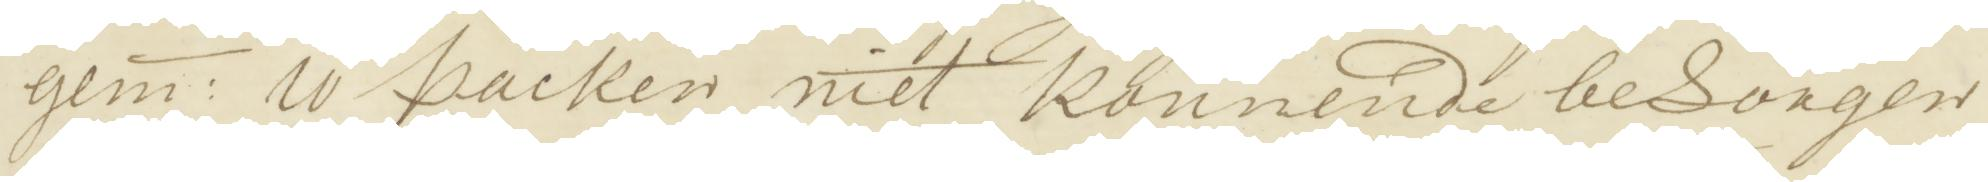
gem: 10 packen niet konnende besorgen
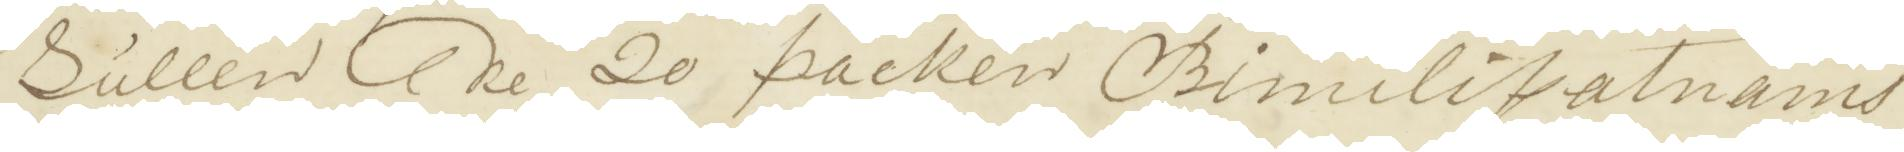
zullen de 20 packen Bimilipatnams
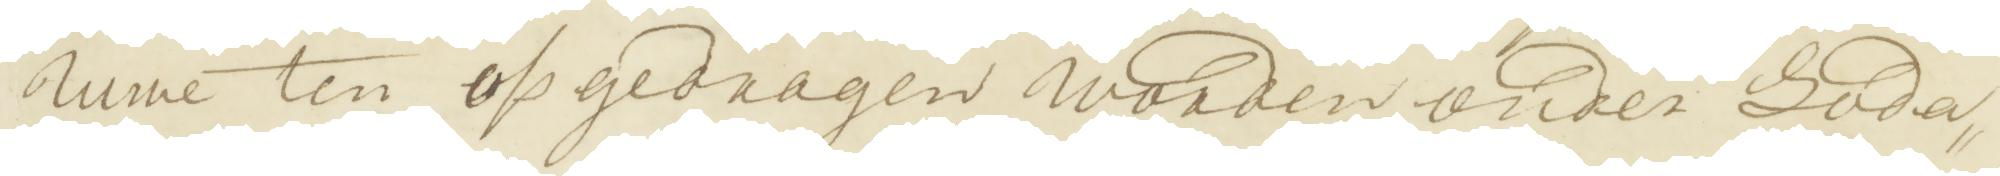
wire ten op gedragen worden onder zoda„
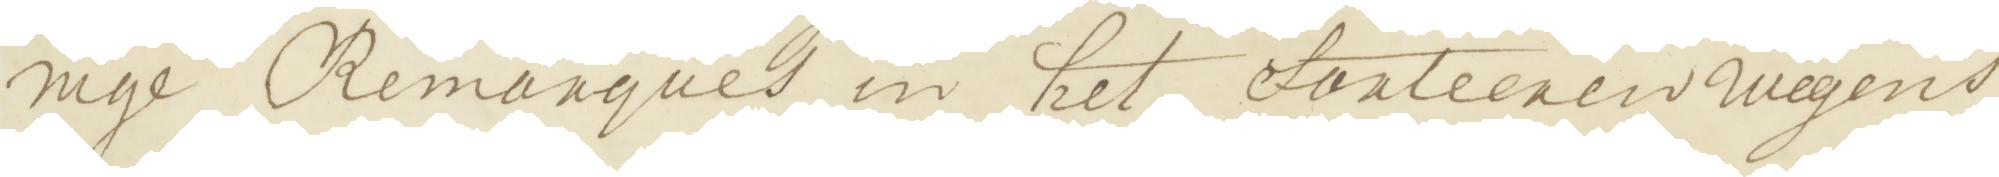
nige Remarques in het sorteeren wegens
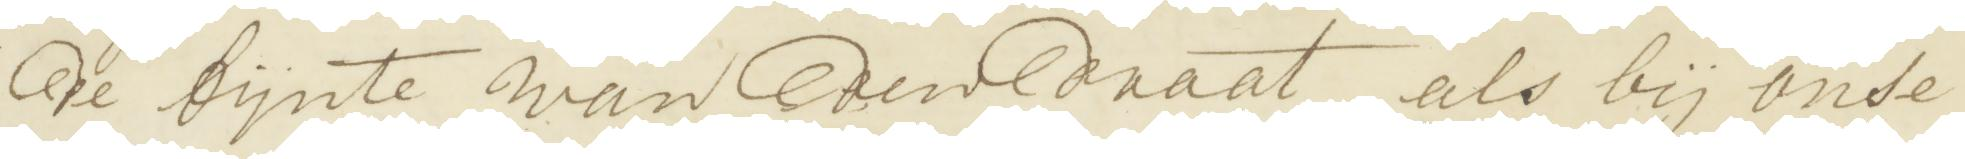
de fijnte van den draat als bij onse
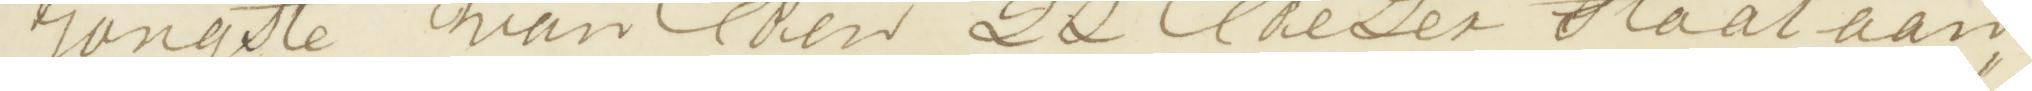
Jongste van den 22 dezer staat aan„
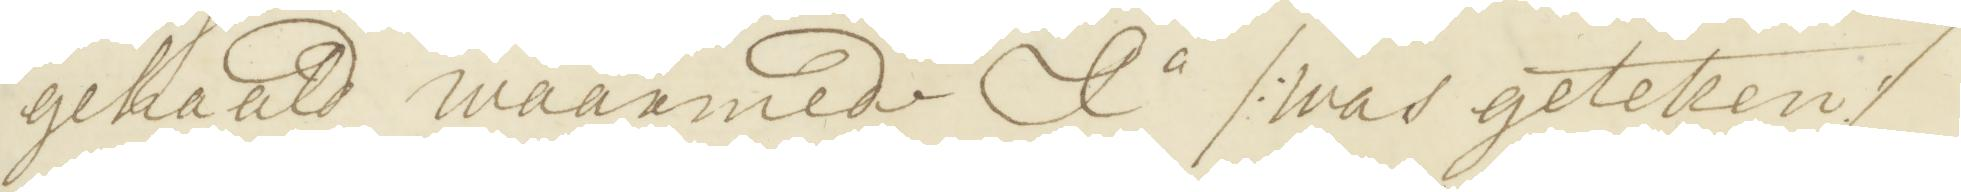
gehaald waarmede &a /:was geteken:/
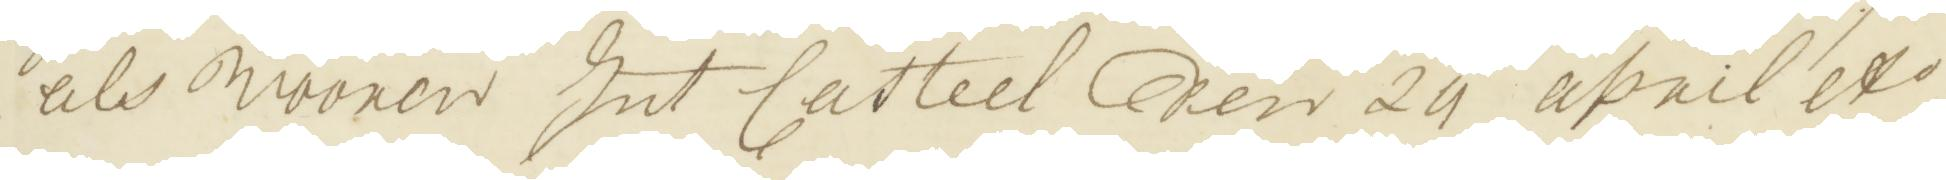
als vooren Jnt Casteel den 24 april Ao
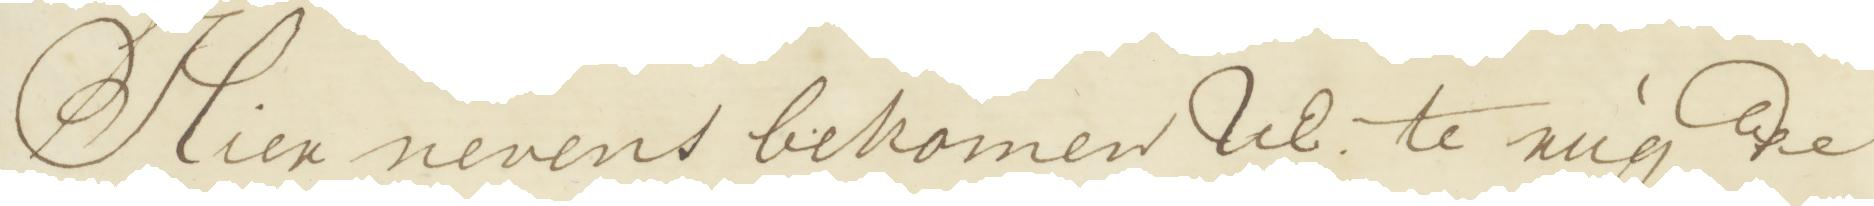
Hier nevens bekomen UE: te rug de
